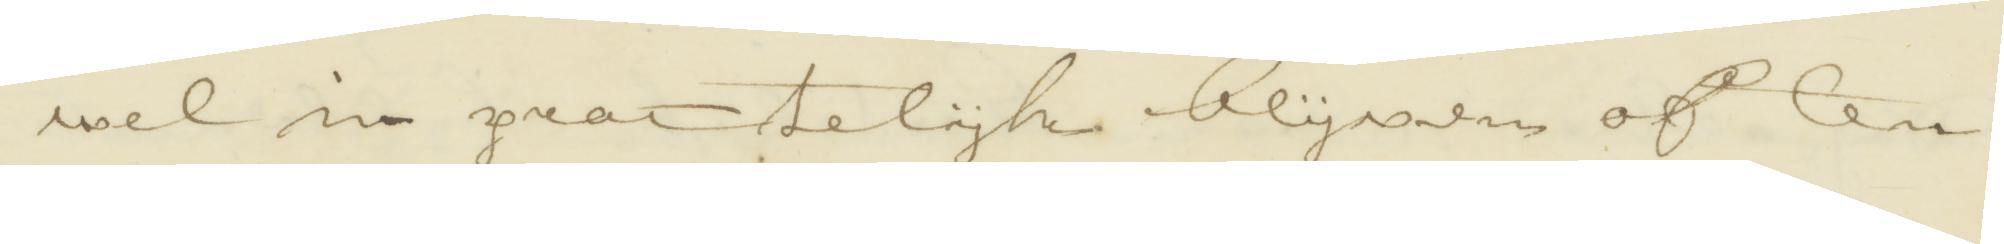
wel in practelijk blijven of ten
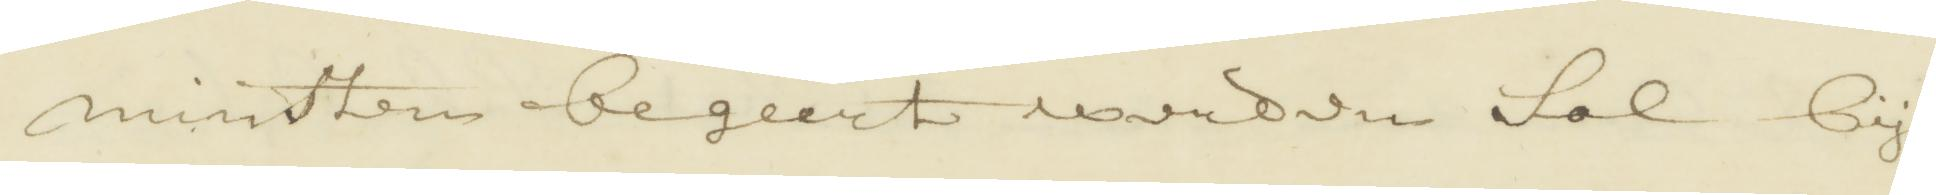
minsten begeert werden sal bij
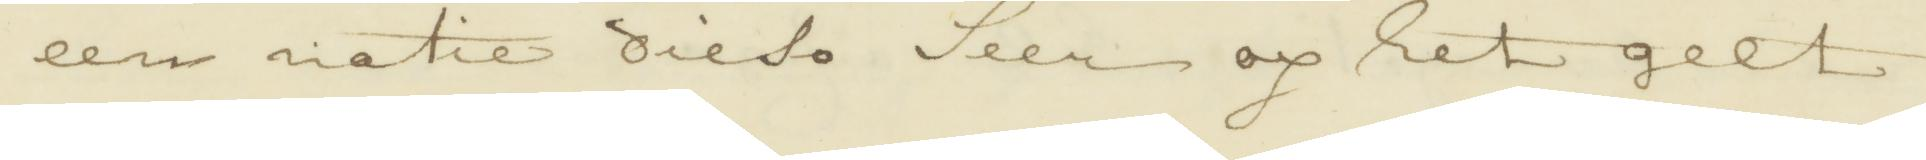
een natie die so seer op het gelt
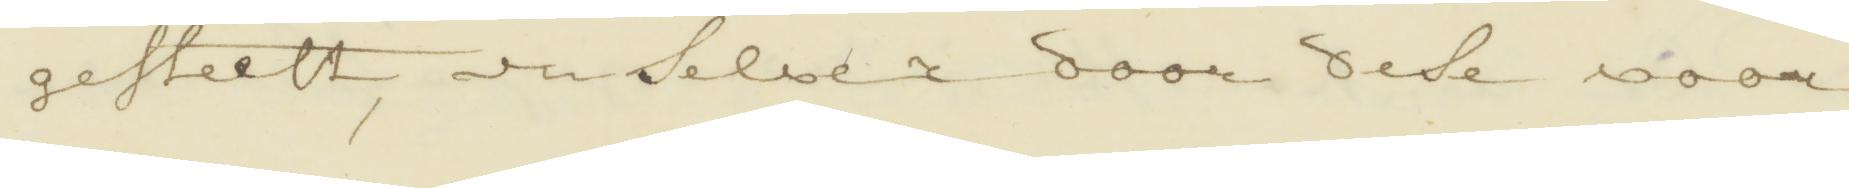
gesteelt, en selver door dese voor
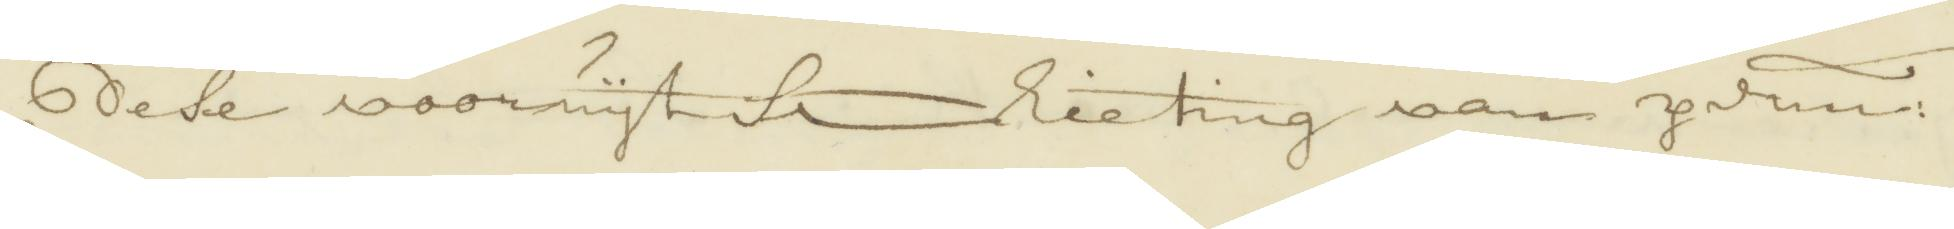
dese vooruijtschieting van penn:
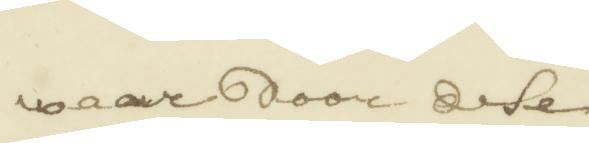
waar door dese
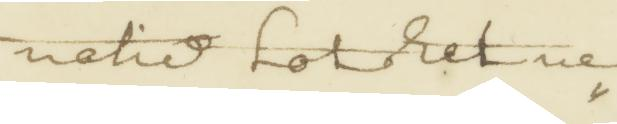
natie tot het ne„
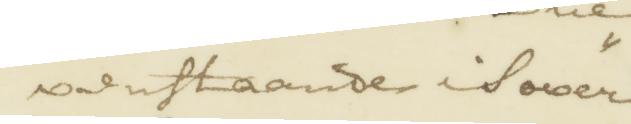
venstaande is over
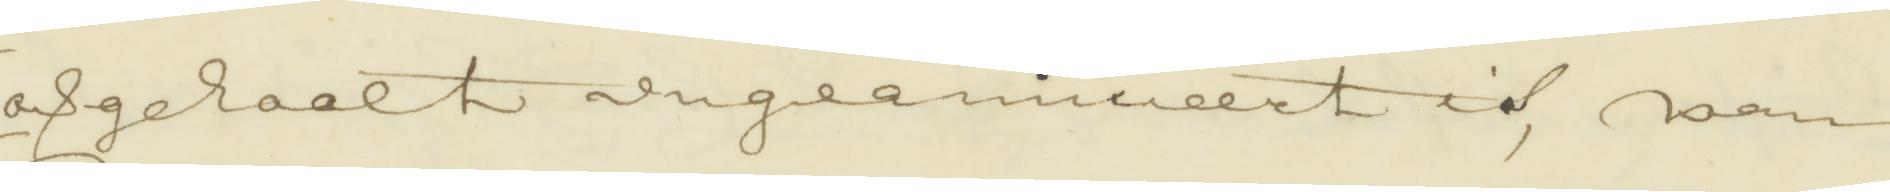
overgehaalt en geamineert is, van
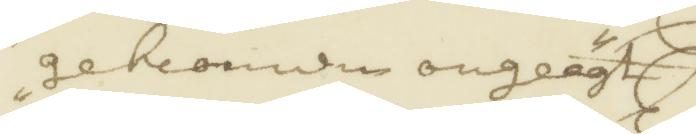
„gekomen ongeagt
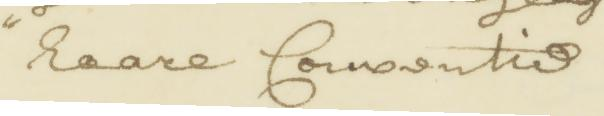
haare Conventie
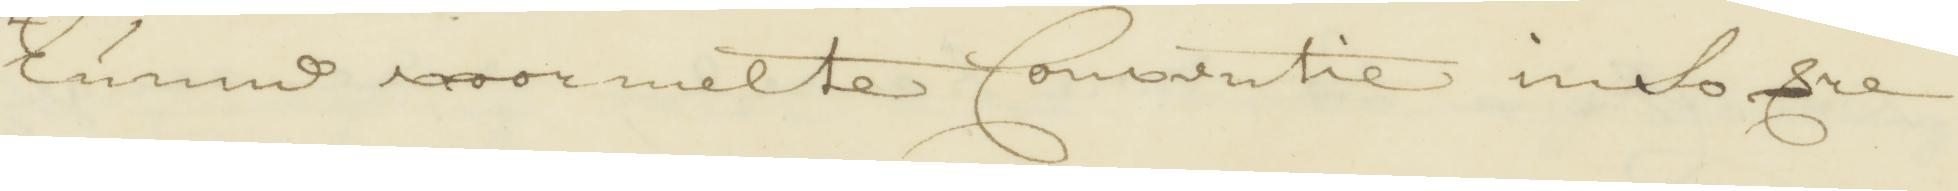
hunne voormelte Conventie inso verre
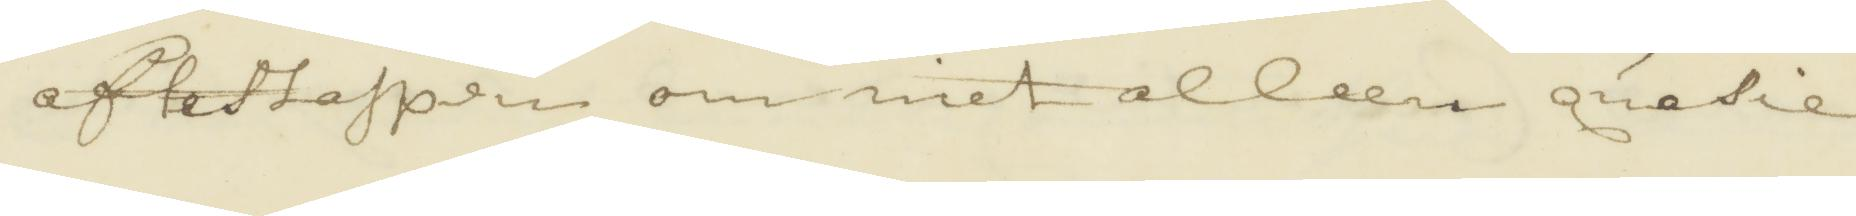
aftestappen, om niet alleen quasie
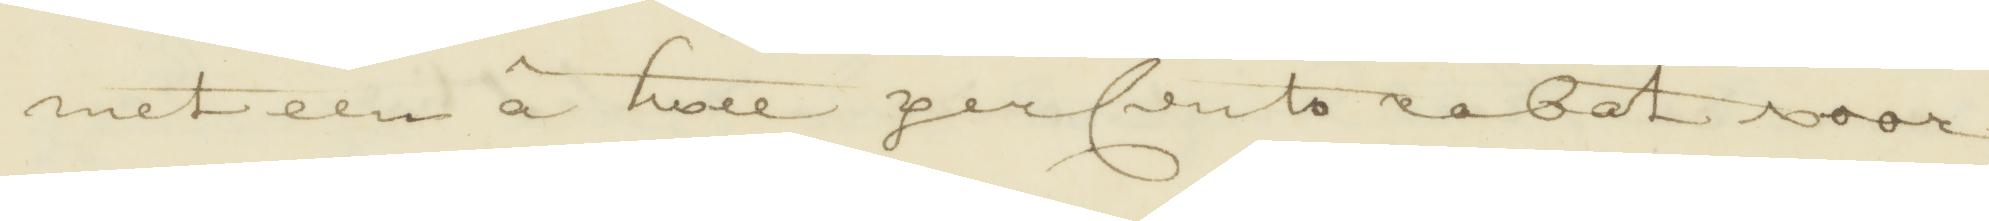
met een â twee percents rabat voor
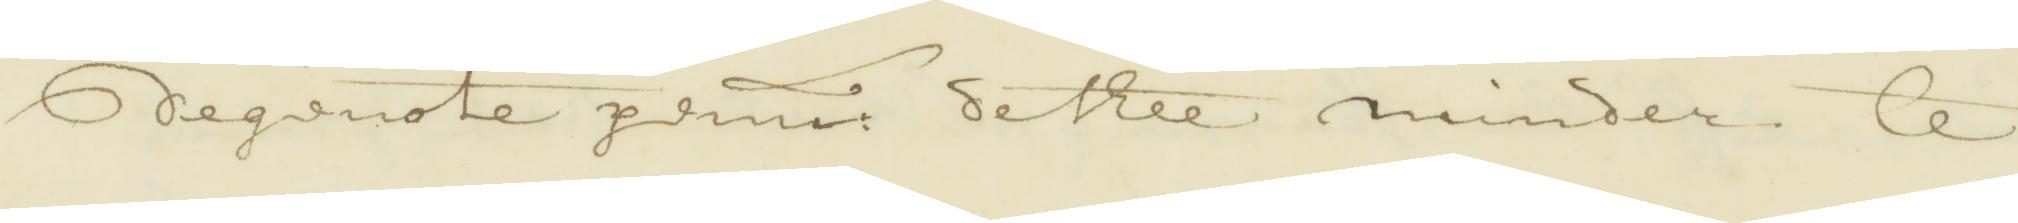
de genote penn: de thee minder te
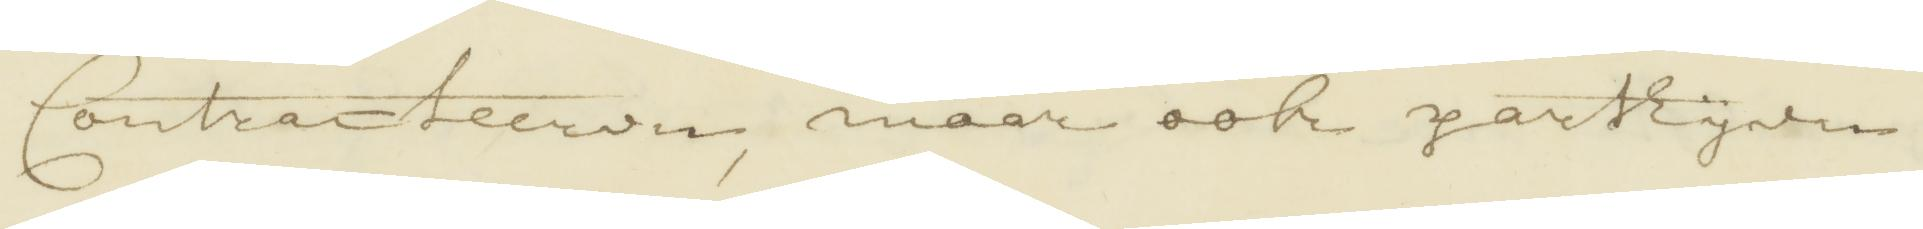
contracteeren, maar ook parthijen
